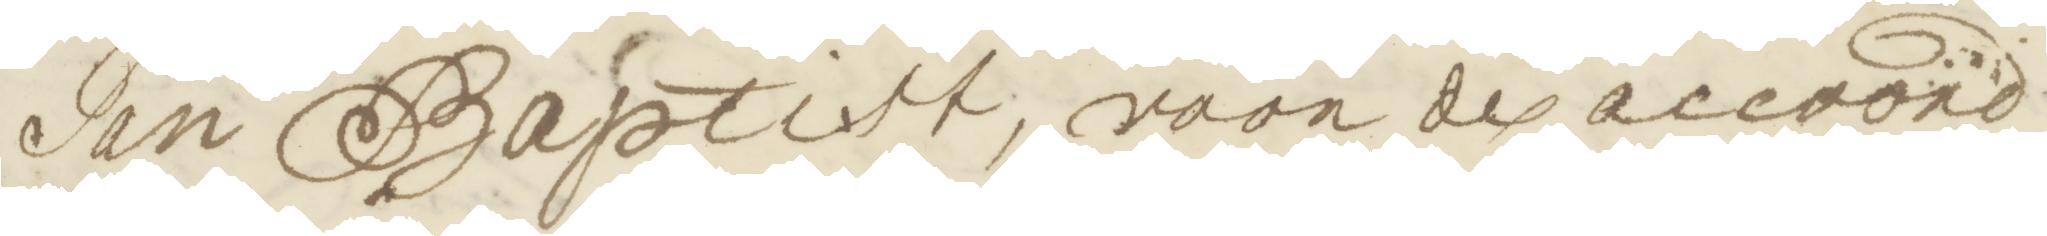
Jan Baptist, voor de accoord
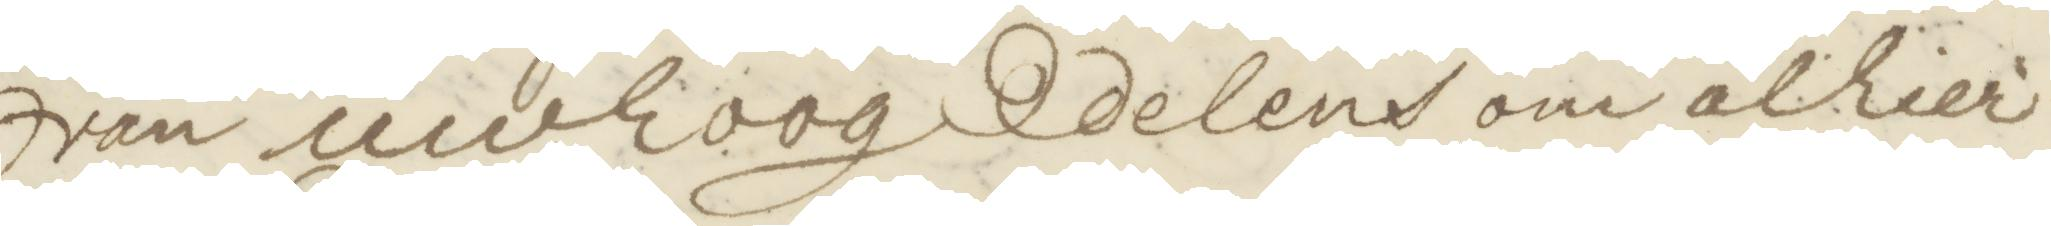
van uwhoog Edelens om alhier
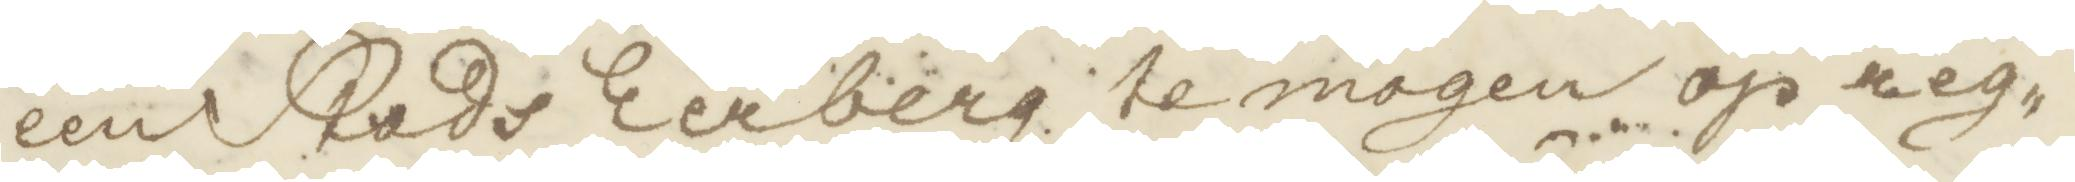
een Stads herberg te mogen op reg„
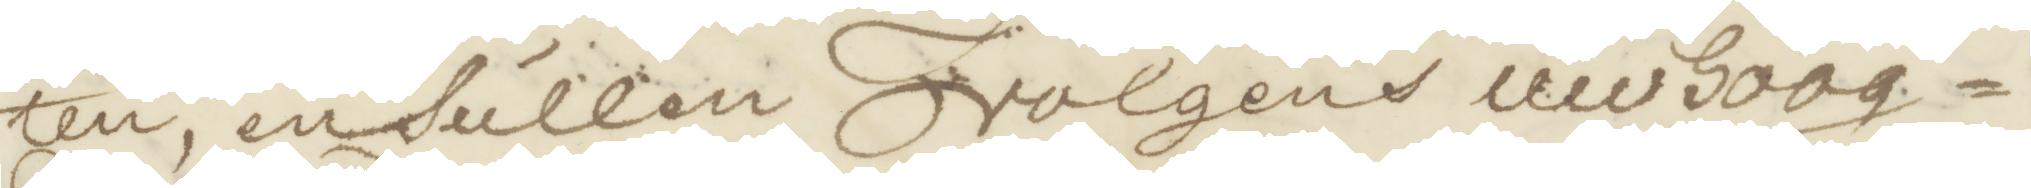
ten, ensullen volgens uw hoog=
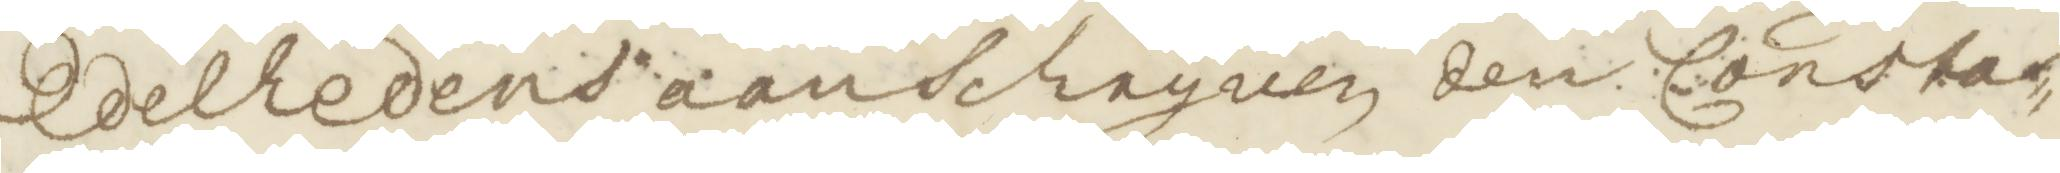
Edelhedens aanschrijven den Consta„
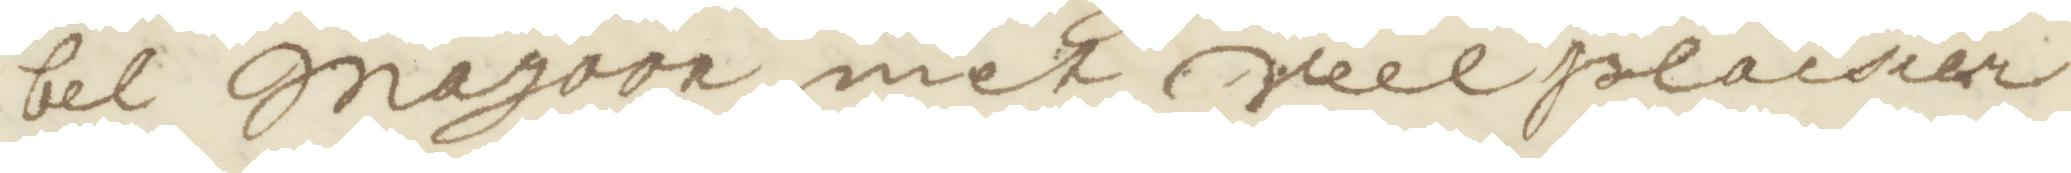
bel Majoor met veel plaisier
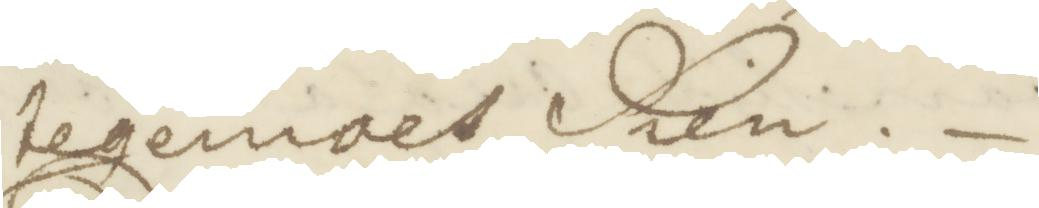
tegemoet sien. —
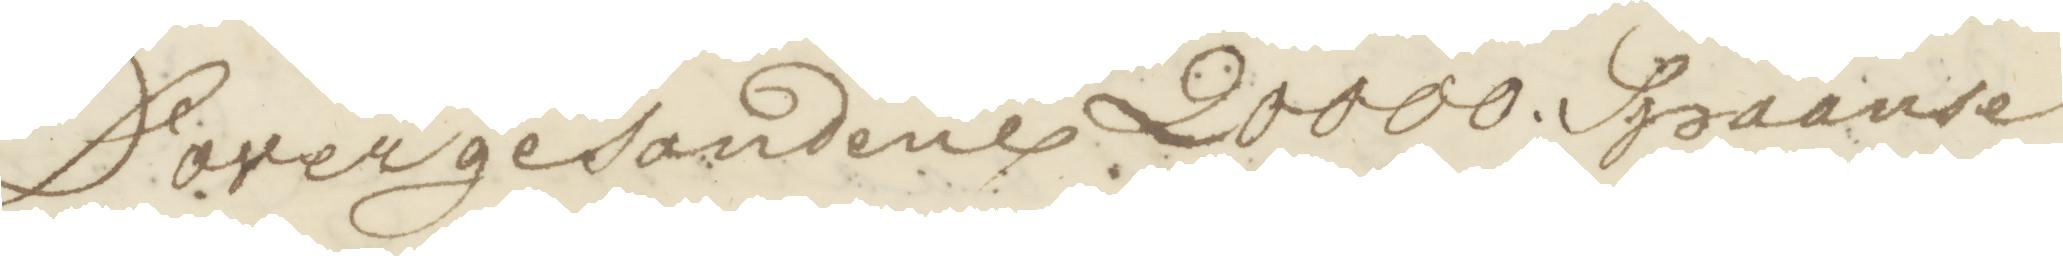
D'overgesondene 20000. Spaanse
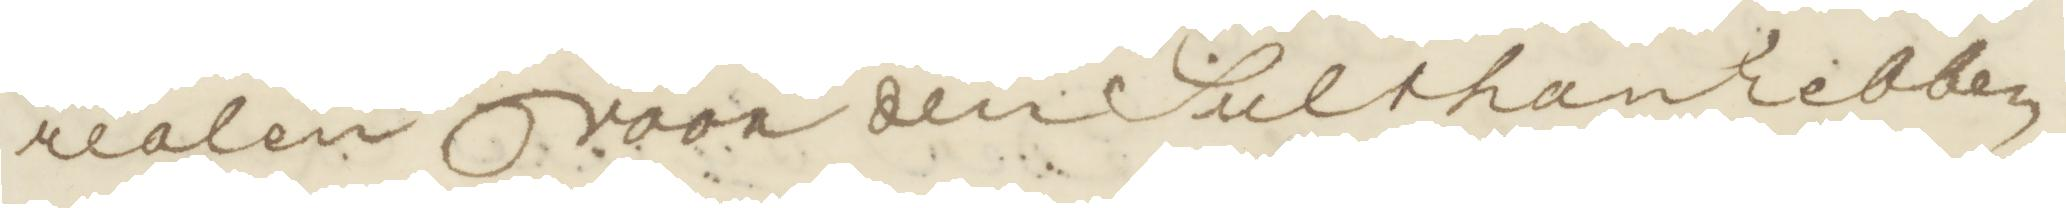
realen voor den Sulthan hebben
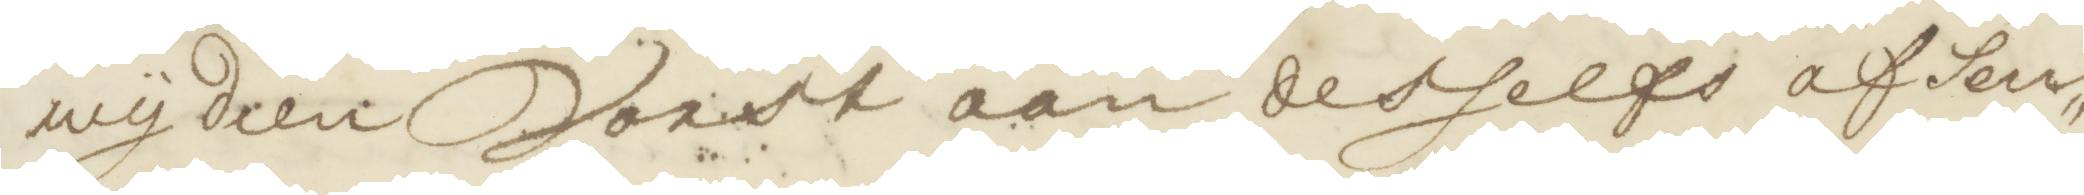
wij dien Vorst aan desselfs afsen
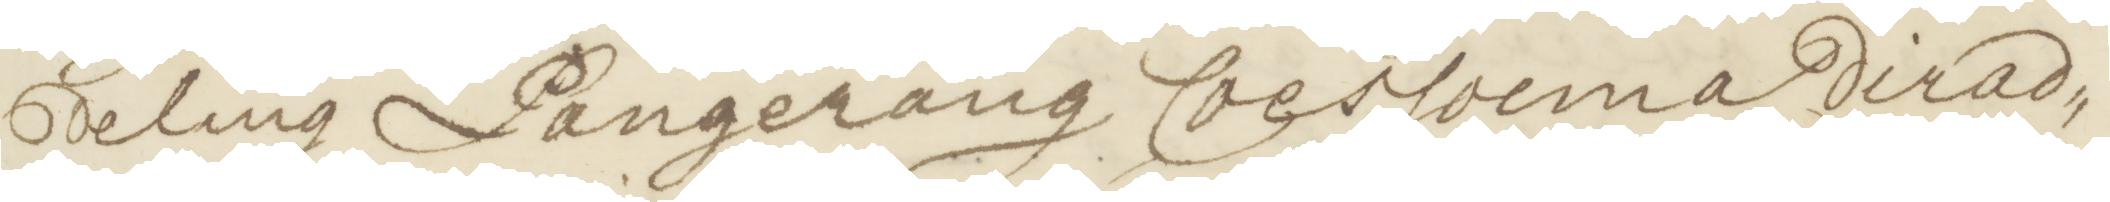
deling Pangerang Coessoema dirad„
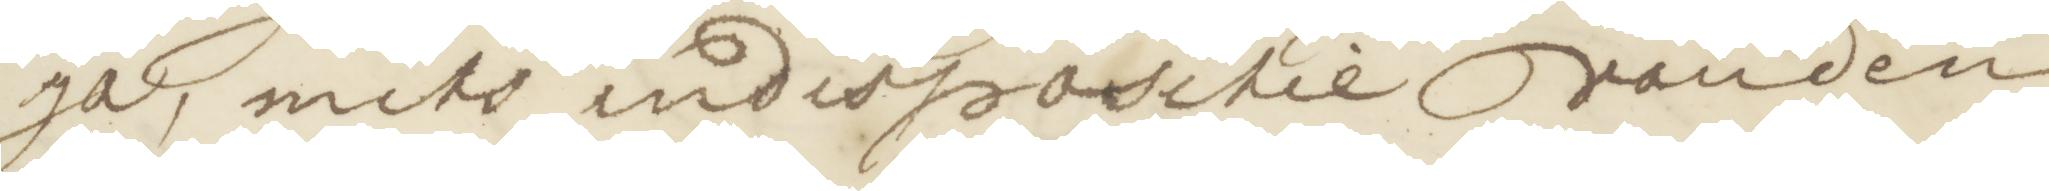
ja, mits indispositie van den
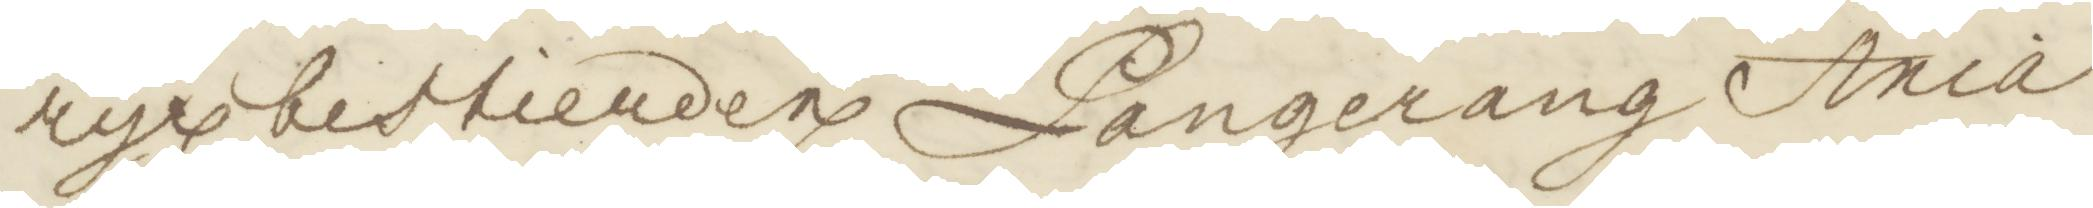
rijx bestierder Pangerang Aria
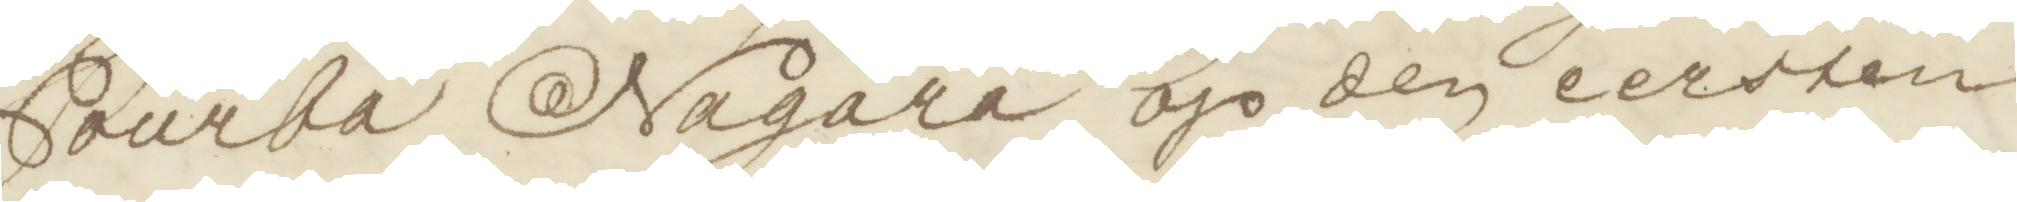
Pourba Nagara op den eersten
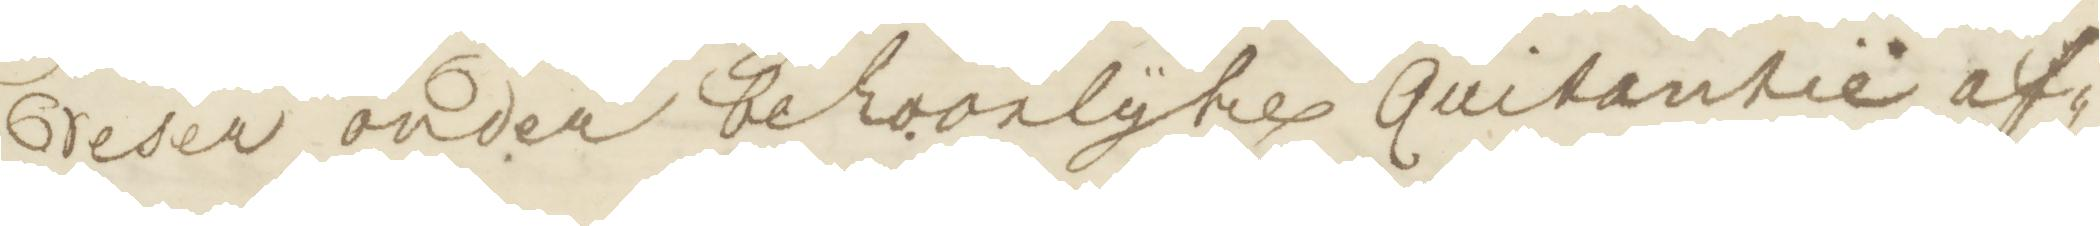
deser onder behoorlijke quitantie af„
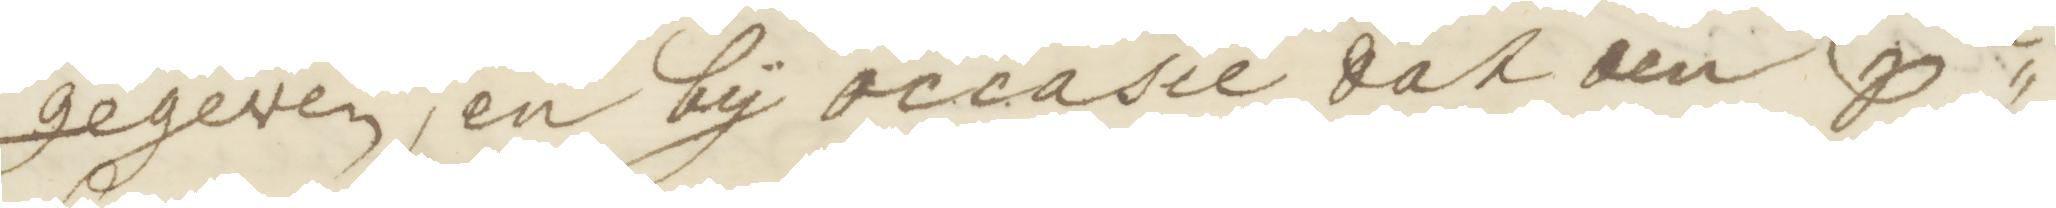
gegeven, en bij occasie dat den Cp„s
